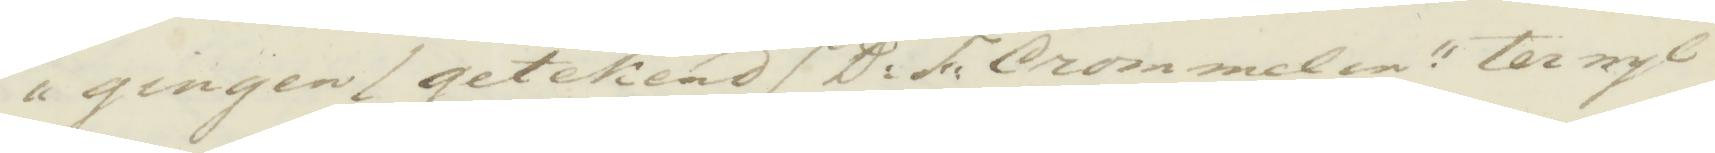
„ gingen / getekend/ D: F: Crommelin .„ terwyl
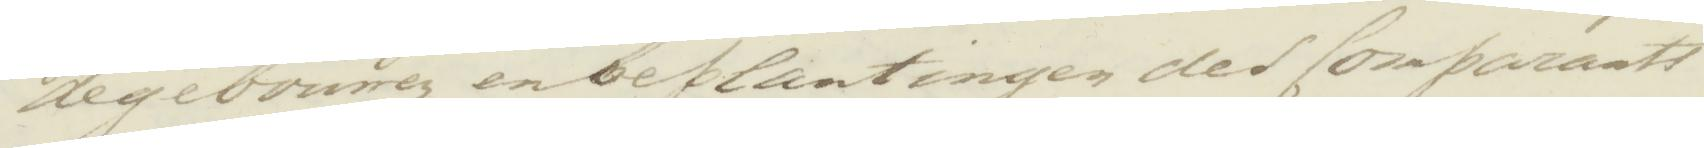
de gebouwen en beplantingen des Comparants
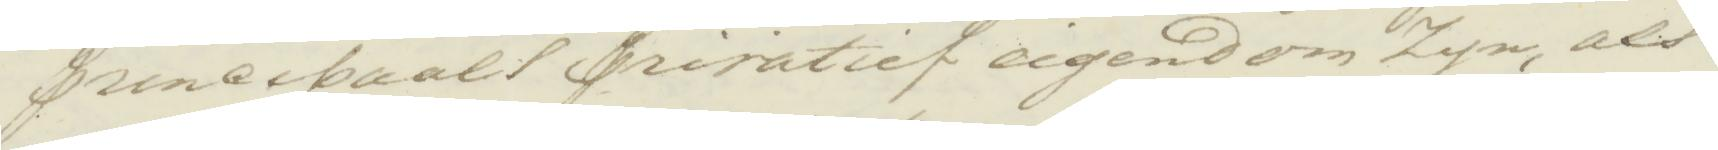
principaals privatief eigendom zyn, als
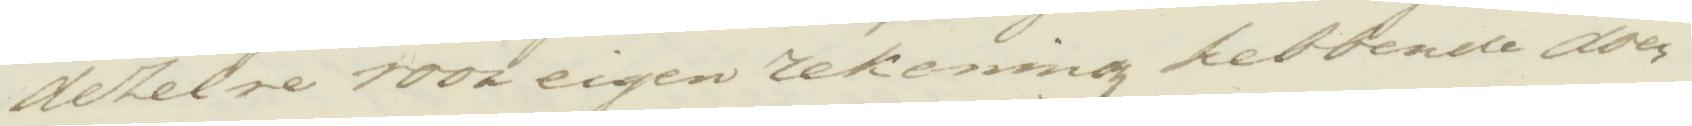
dezelve voor eigen rekening hebbende doen
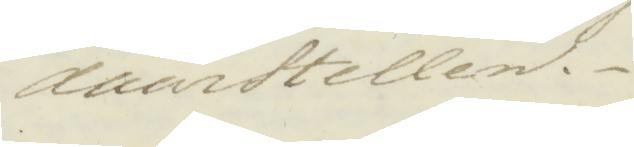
daarstellen.-
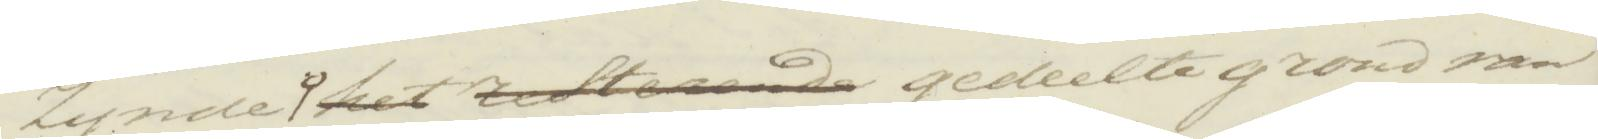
Zynde 1 het resterende gedeelte grond van
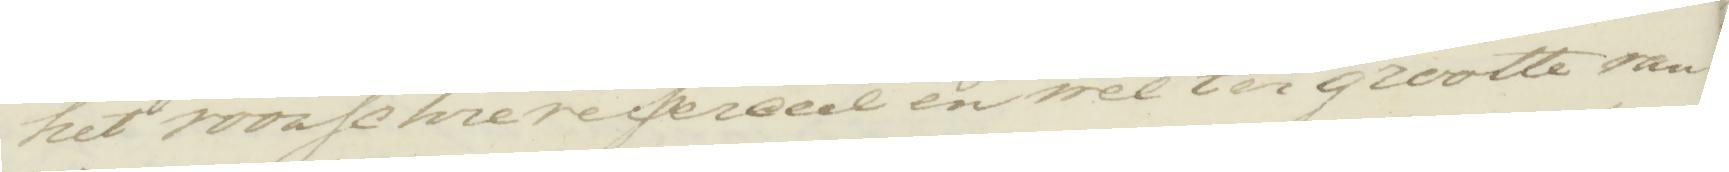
het voorschreve perceel en wel ter grootte van
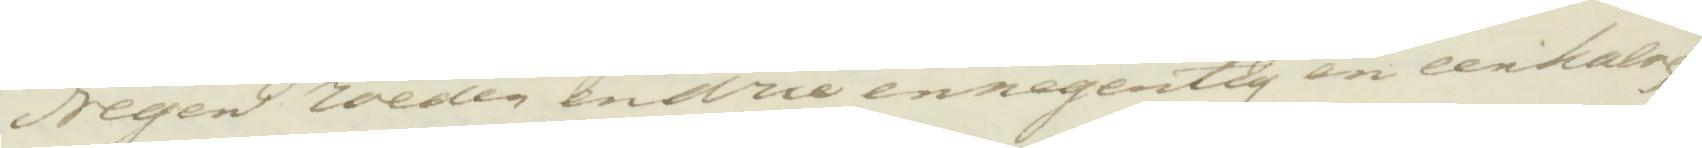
Negen roeden en drie en negentig en een halve
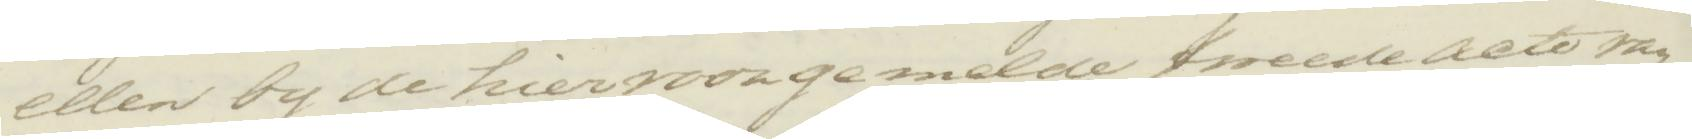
ellen by de hier voorgemelde tweede acte van
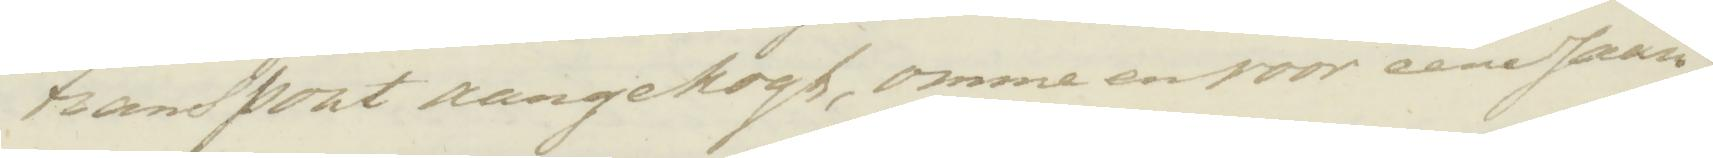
transport aangekogt, omme en voor eene jaar
